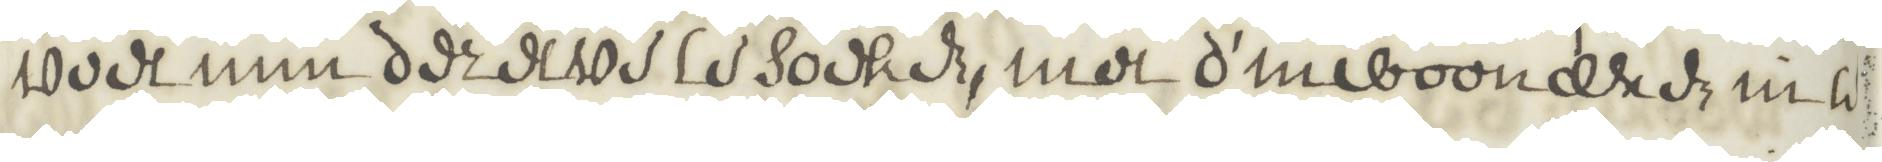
veel min dezelve te soeken, met d’ inwoonderen in te
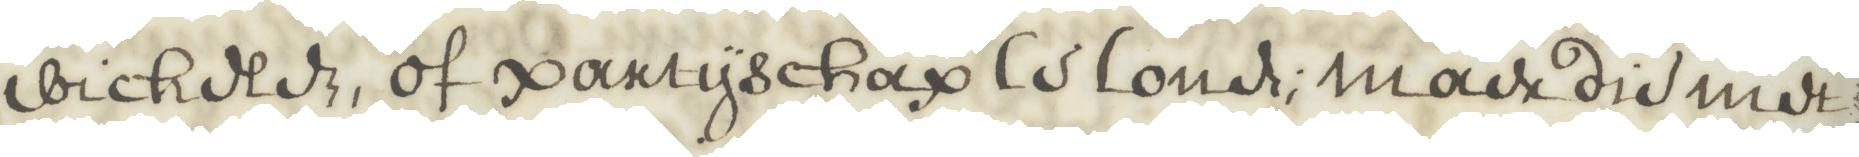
wickelen, of partijschap te tonen; maer die niet
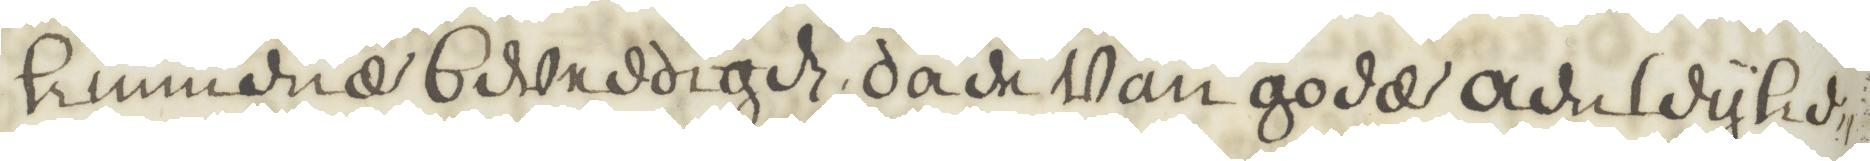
kunnende bevredigen, daer van goede aenteijke„
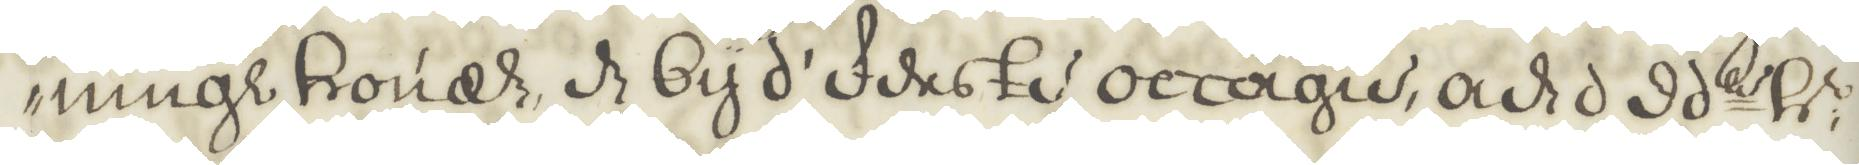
„ningh houden, en bij d’ Eerste occagie, aen d ed=le h:r
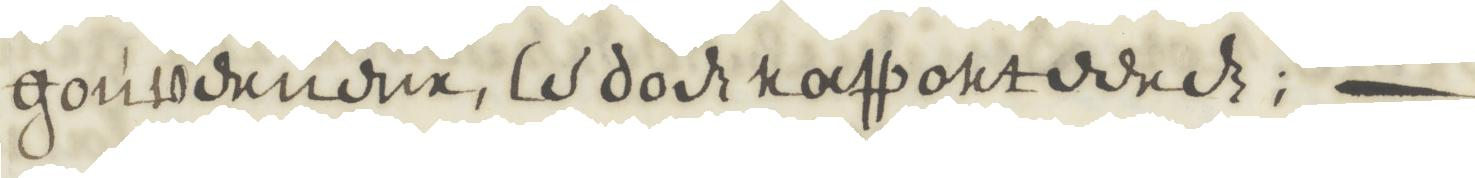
gouverneur, te doen rapporteeren; —
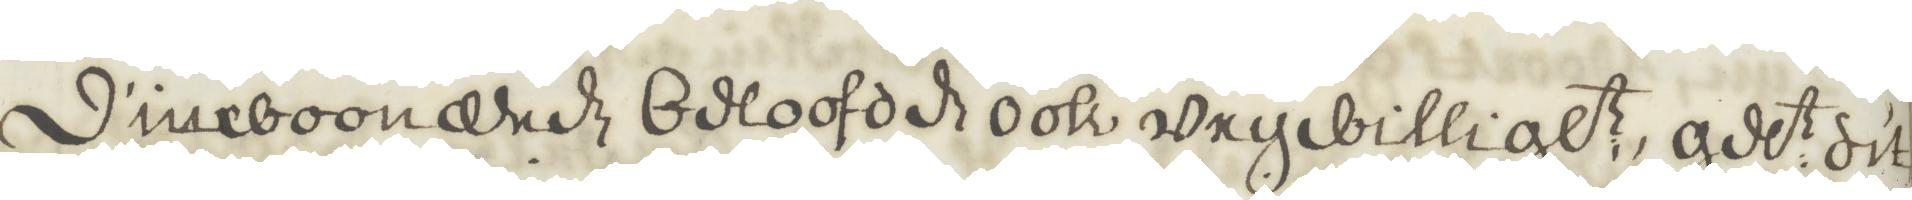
D' inwoonderen beloofden ook vrijwilliglijk, gelijk dit
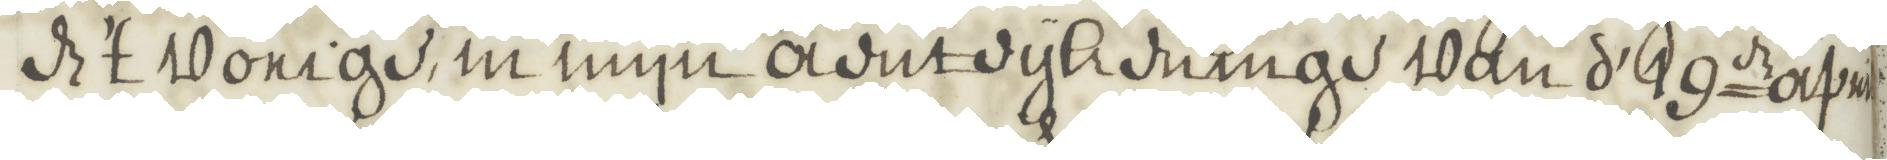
en ’t vorige, in mijn aenteijkeninge van d’ 19=en april
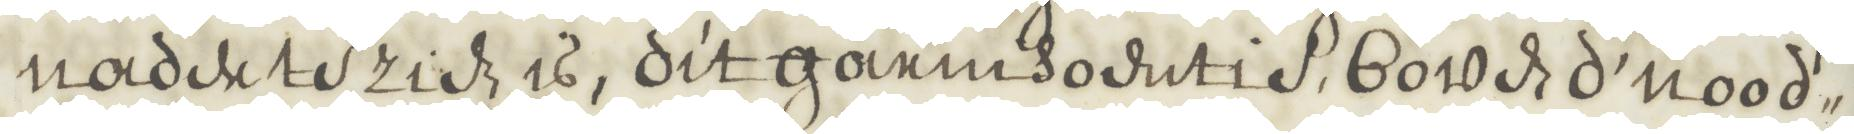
nader te zien is, dit garnisoentis, boven d’ nood„
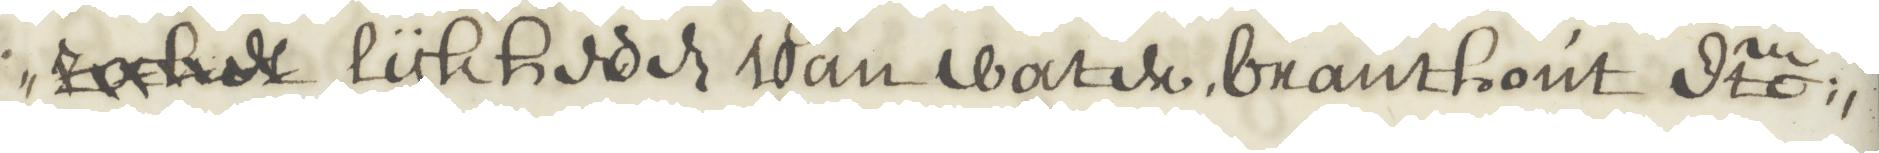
„ lijkheden van water, branthout Etc;,
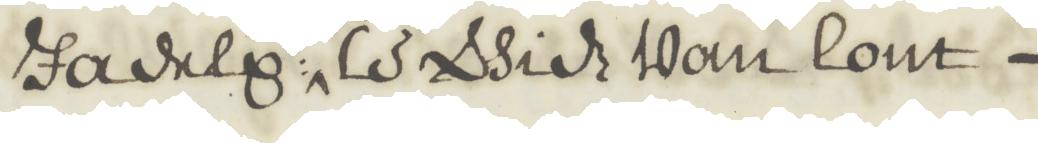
Jaerlx:-^ ^ook te versien van lont -
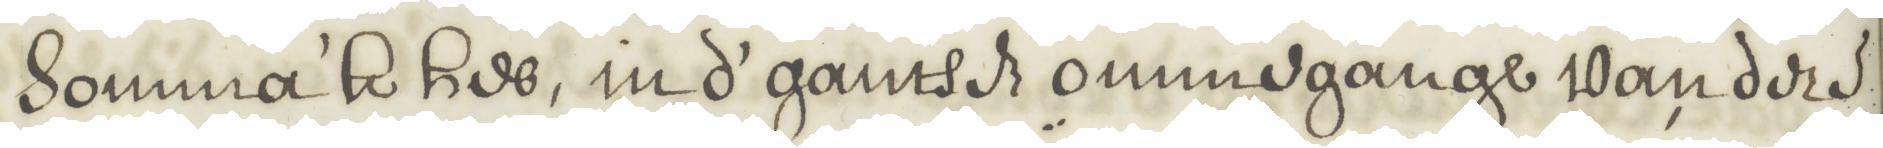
Somma'k heb, in d’ gantsen ommegangh van deze
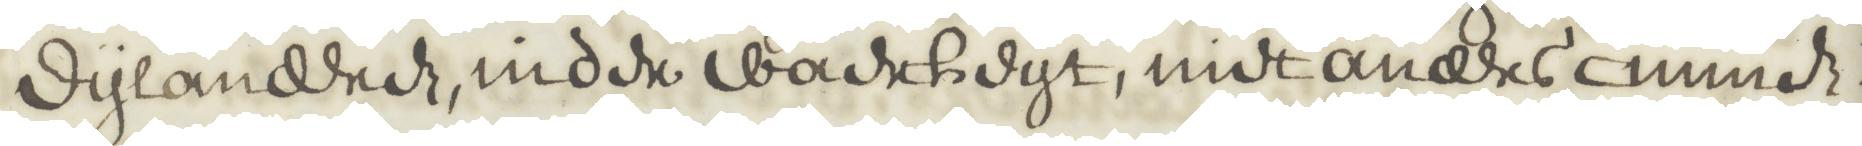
Eijlanderen, inder waerheijt, niet anders cunnen
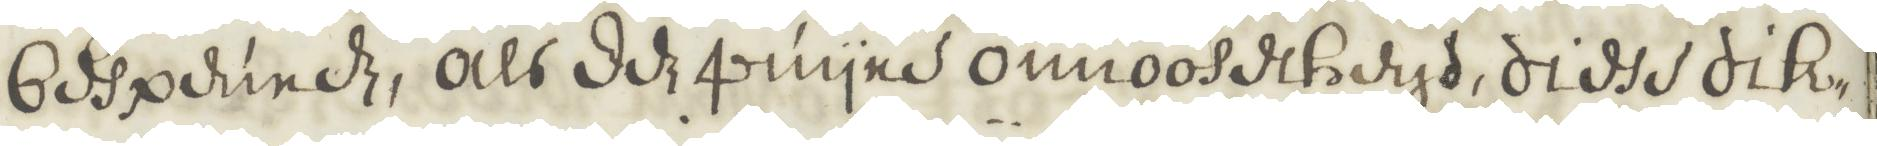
bespeuren, als een puijre onnooselheijd, diese dik„
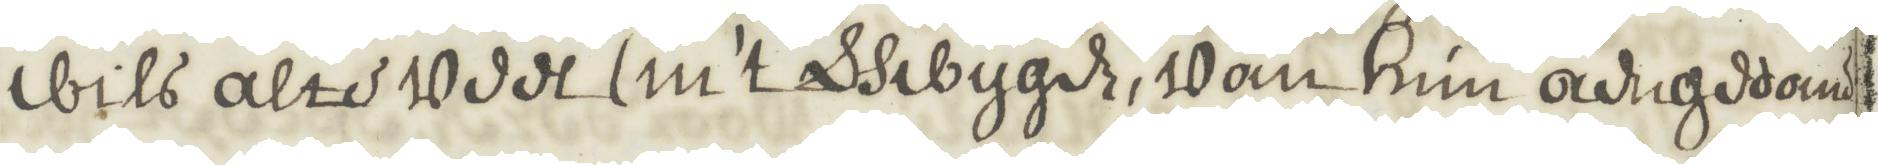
wils alte veel (in ’t verswijgen, van hun aengedane
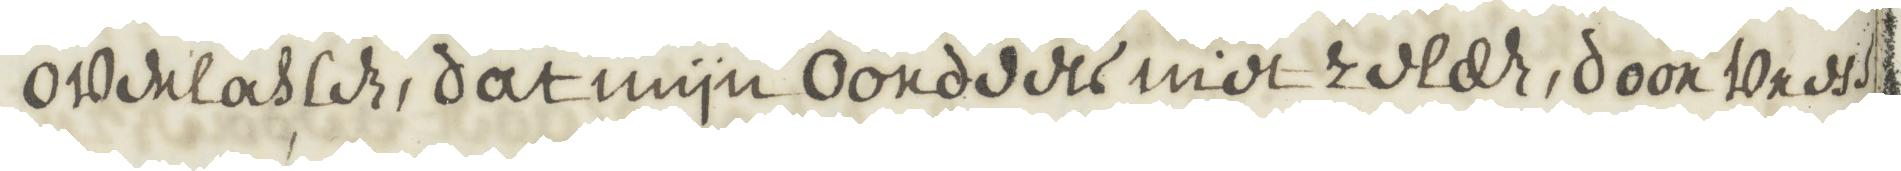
overlasten, dat mijn Oordeels niet zelden, door vrese
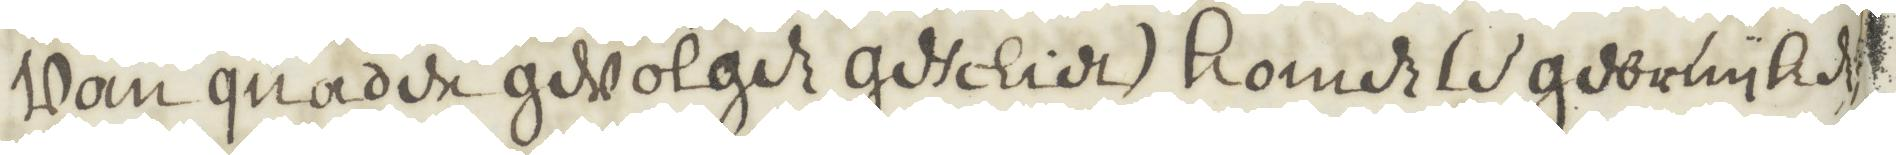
van quader gevolgen geschiet) komen te gebruijken,
